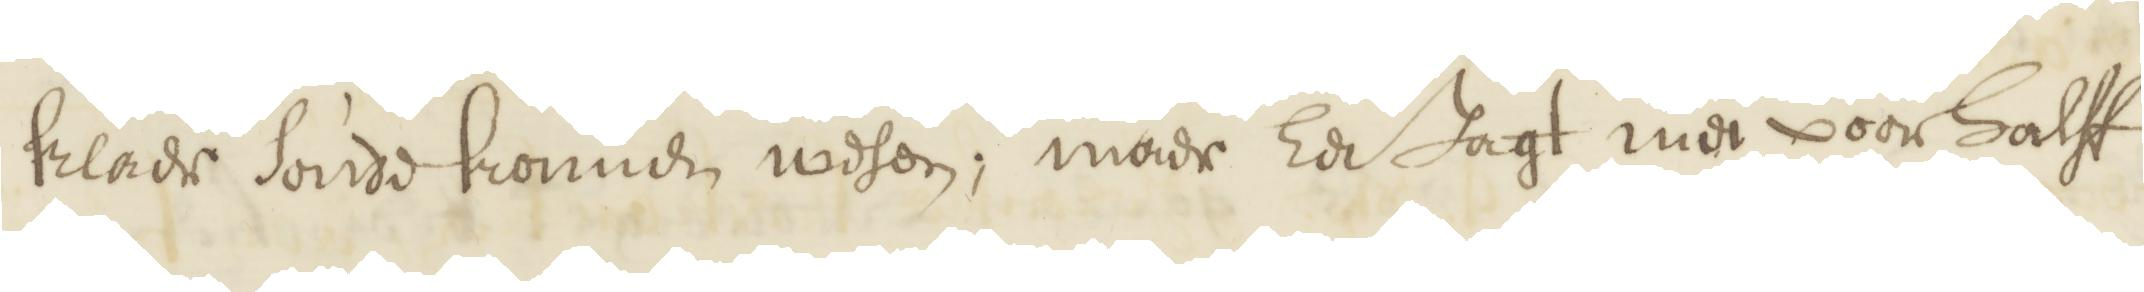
klaer soude konnen wesen; maer het Jagt niet voorhalff
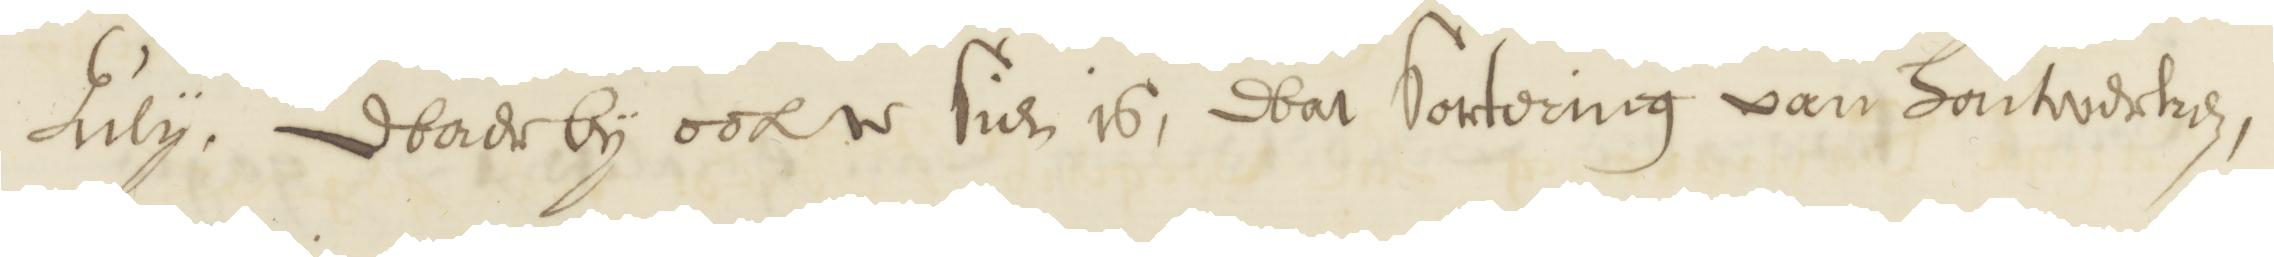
Iulij, waerbij ook te sien is, wat sortering van houtwerken,
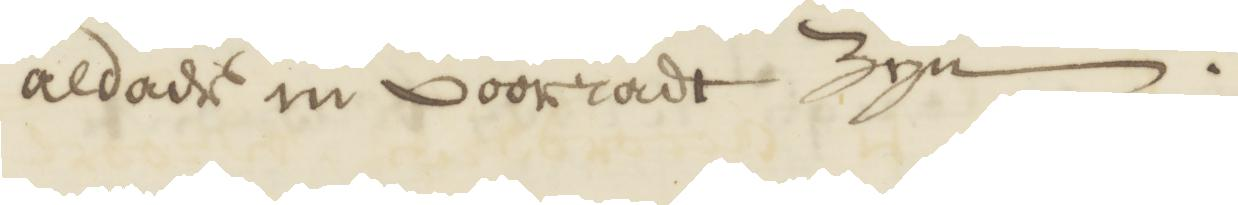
aldaer in voorraet zijn.
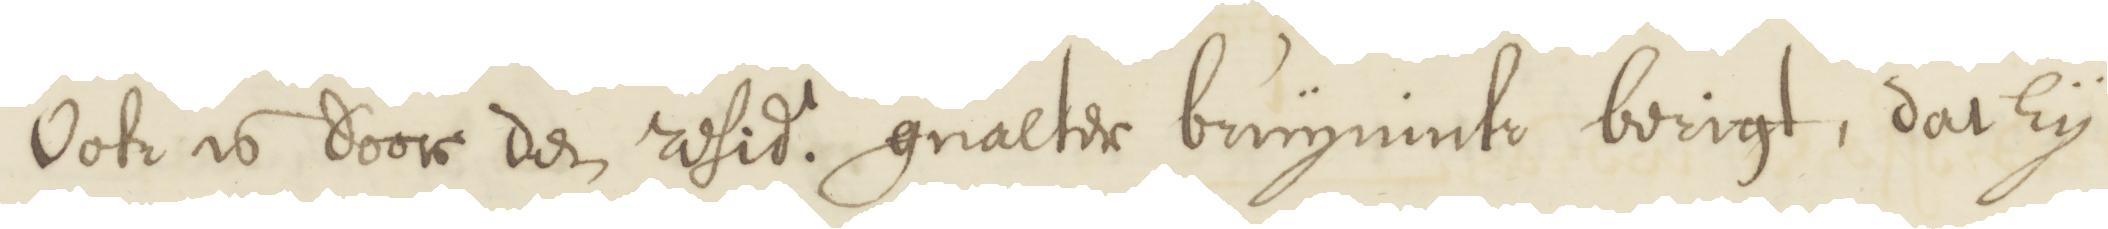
Ook is door den resid.t gualter bruijnink berigt, dat hij
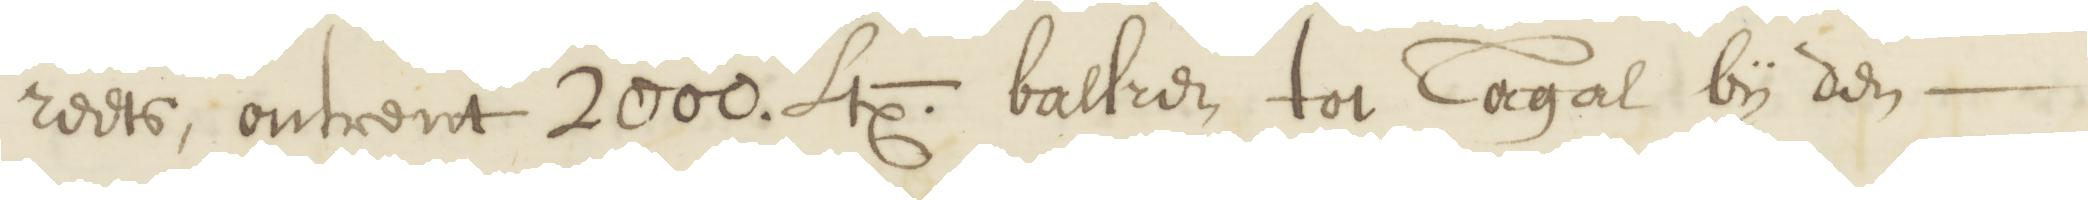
reets, ontrent 2000. stx. balken tot Tagal bij den —
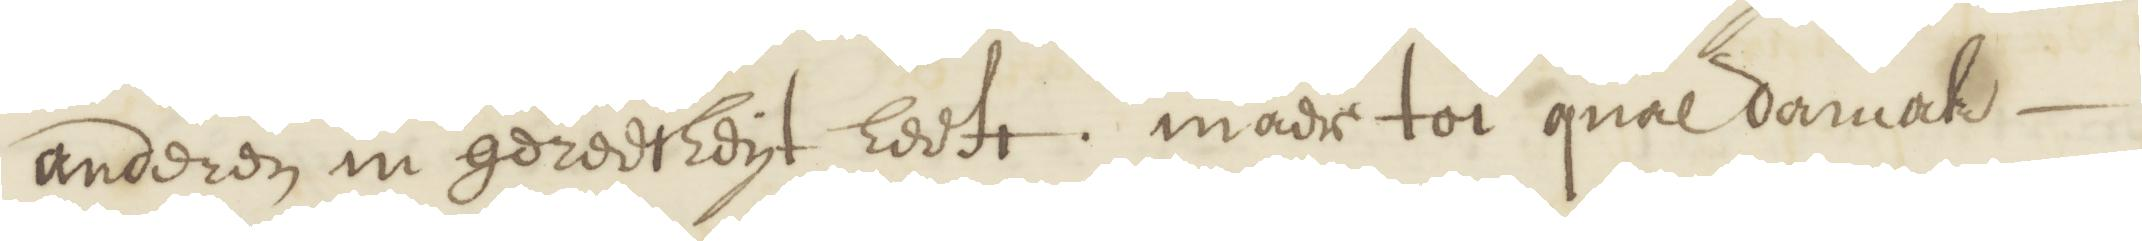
anderen in gereetheijt heeft. maer tot qualdamak —
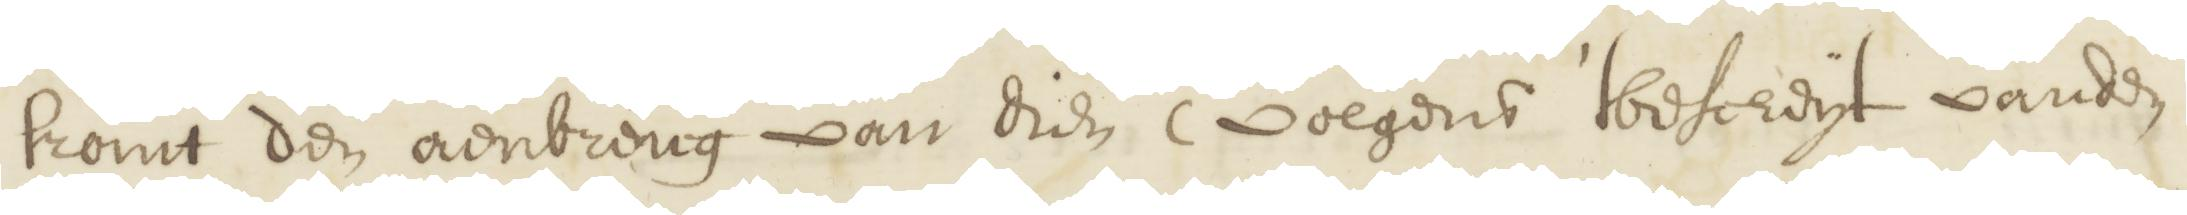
komt den aenbreng van dien (volgens 'tbescheijt vanden
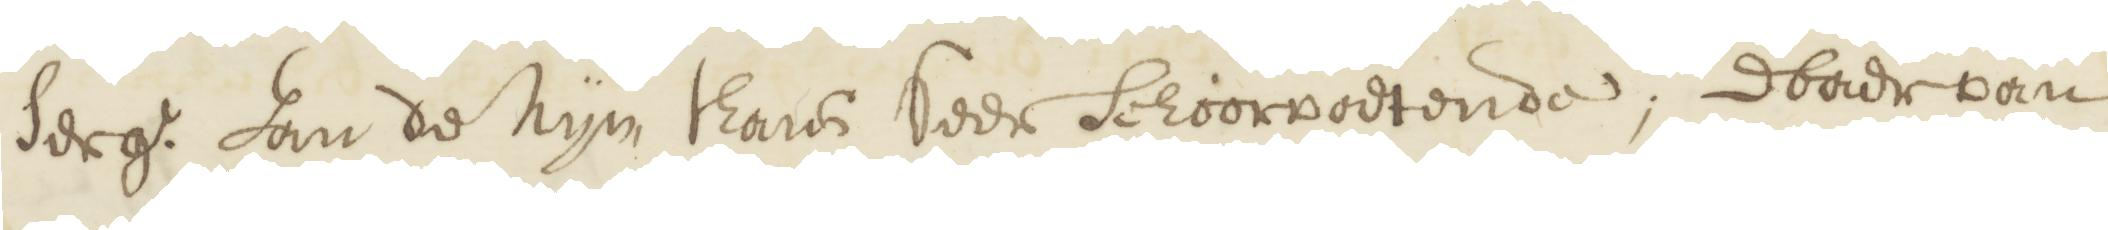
serg.t Jan de zijn, thans seer schoorvoetende; waer van
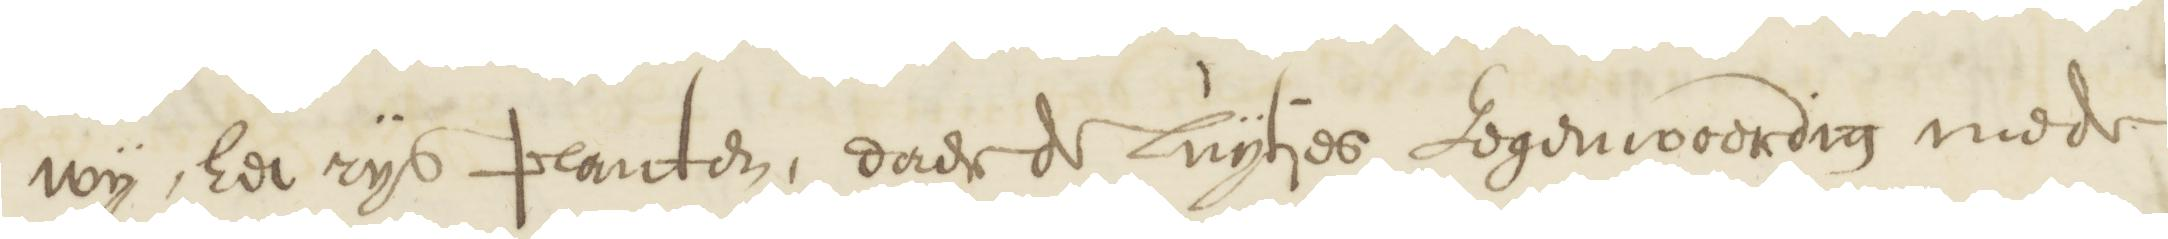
wij, het rijs planten, daer de luijtjes Iegenwoordig mede
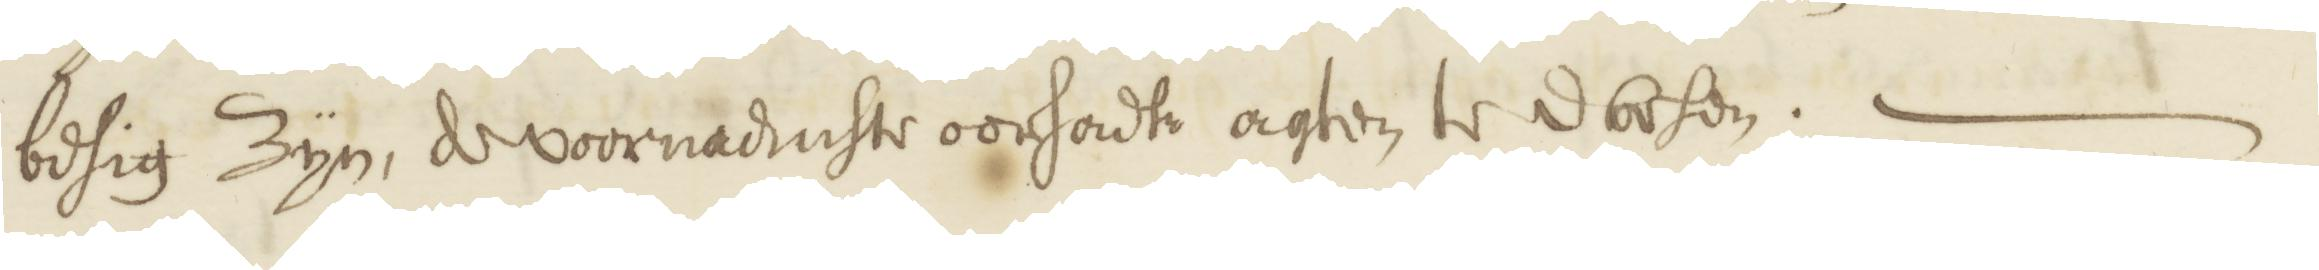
besig zijn, de voornaemste oorsaek agten te wesen. —
